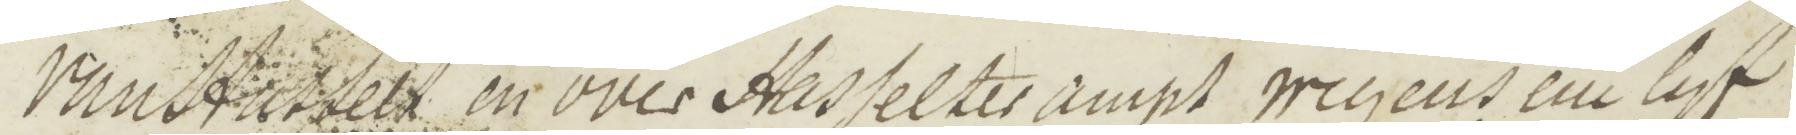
Van Hasselt en over Hasselter ampt weegens en lyf
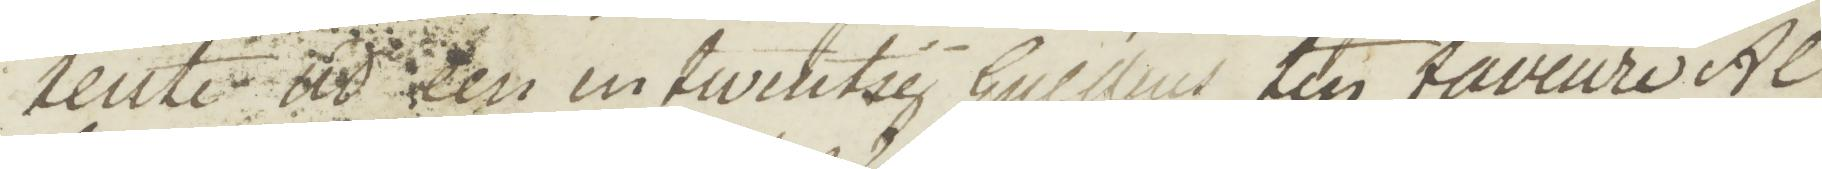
rente ad een en twintig Guldens ten faveure Al
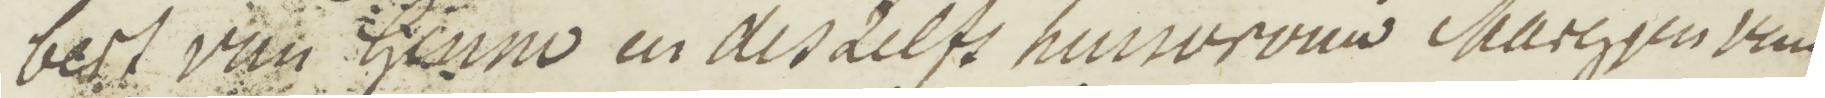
bert van Geune en deszelfs huisvrouw Margjen van
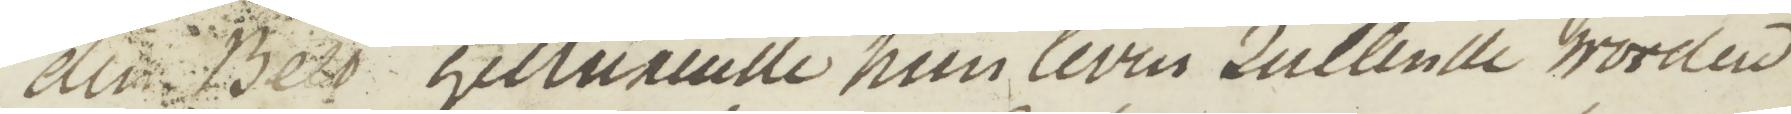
den Belt gedurende hun leven Zullende worden
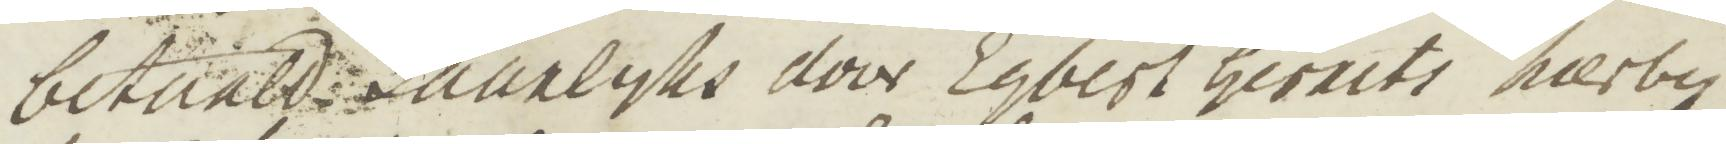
betaald: Iaarlyks door Egbert Gerrits hierby
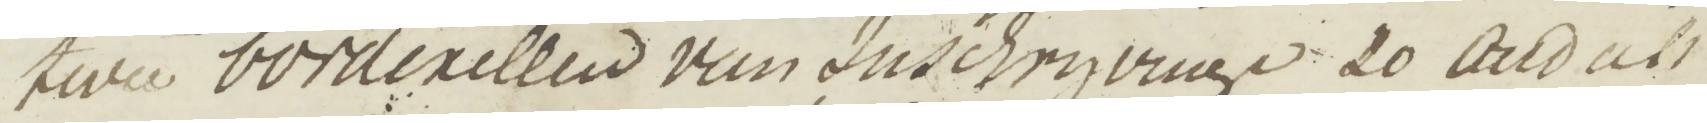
twee borderellen van Inschryving zo Oud als
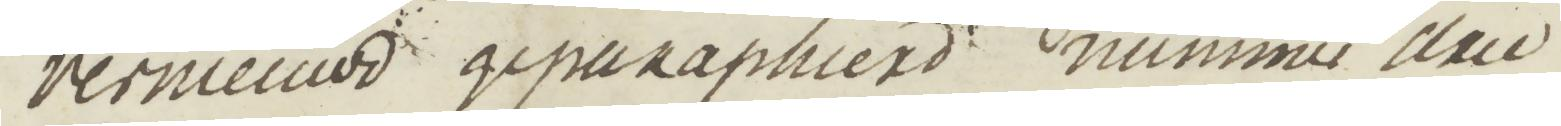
vernieuwd geparapheerd: nummer drie
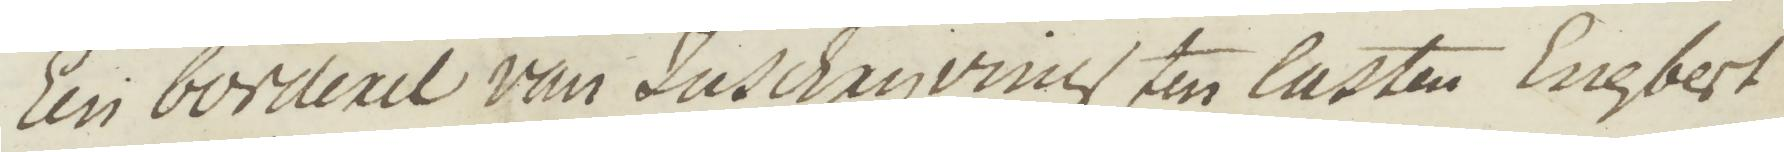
Een borderel van Inschryving ten lasten Engbert
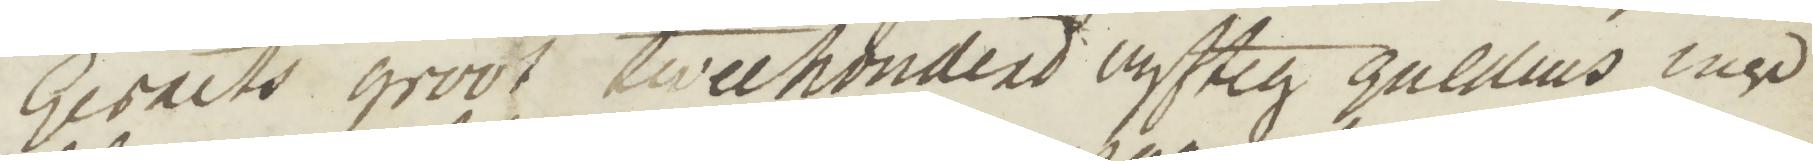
Gerrits groot twee honderd vyftig guldens inge
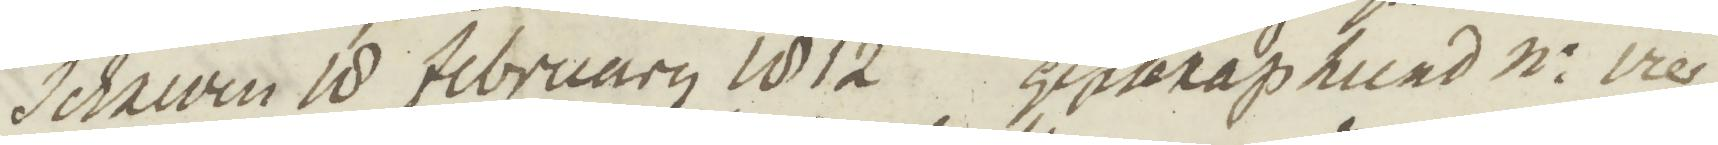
schreven 18 february 1812 Geparapheerd n: vier
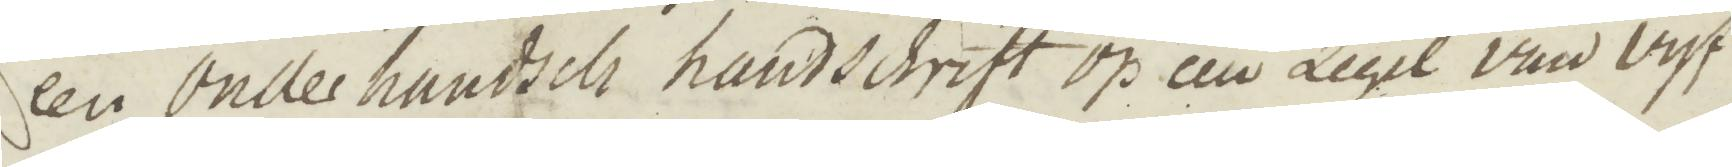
een Onderhandsch handschrift op een Zegel van vyf
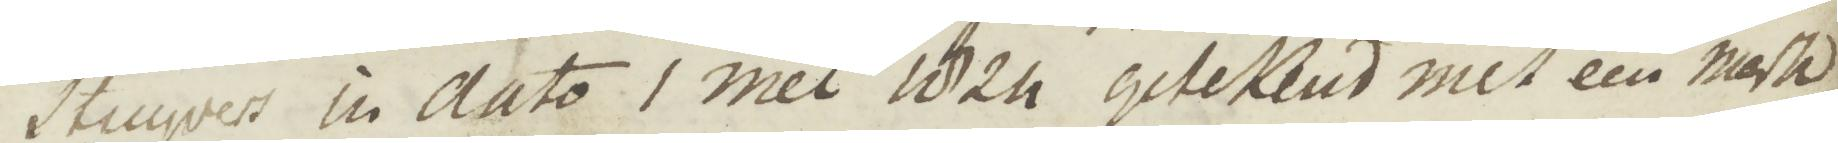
stuyvers in dato 1 mei 1824 getekend met een merk
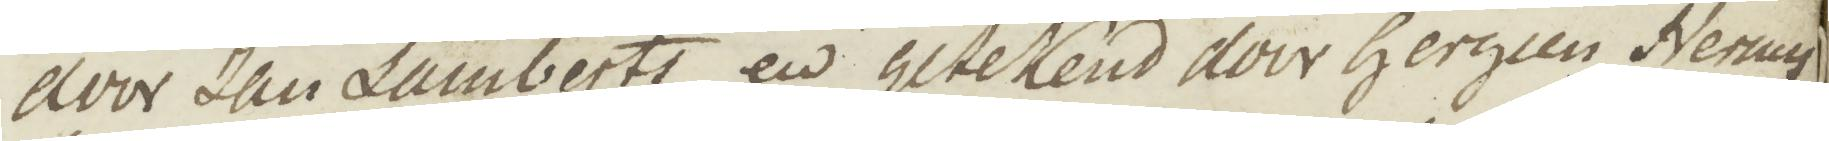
door Ian Lamberts en getekend door Gergien Nering
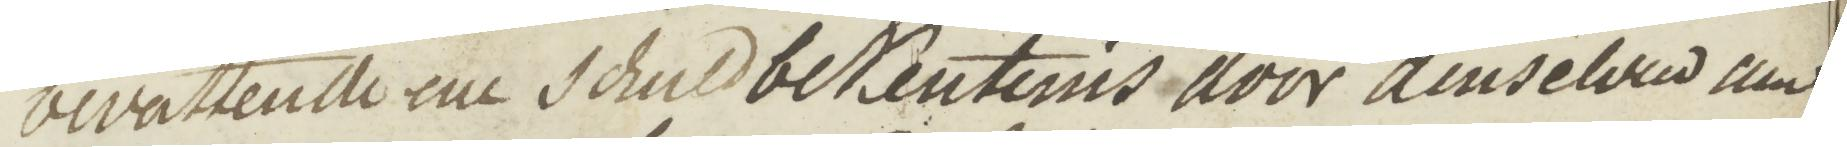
bevattende ene schuldbekentenis door denselven aan
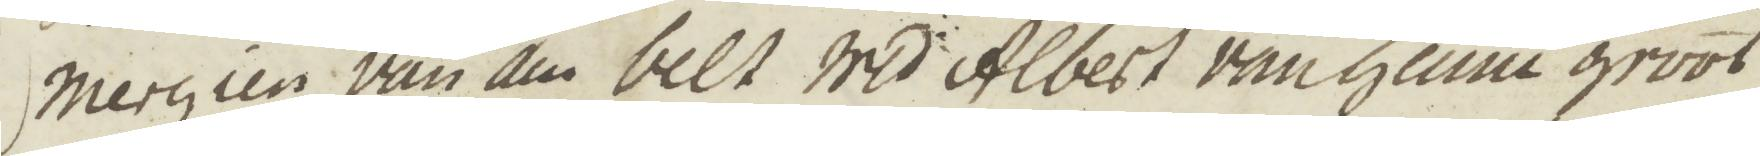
Mergien van den belt wed' Albert van Geune groot
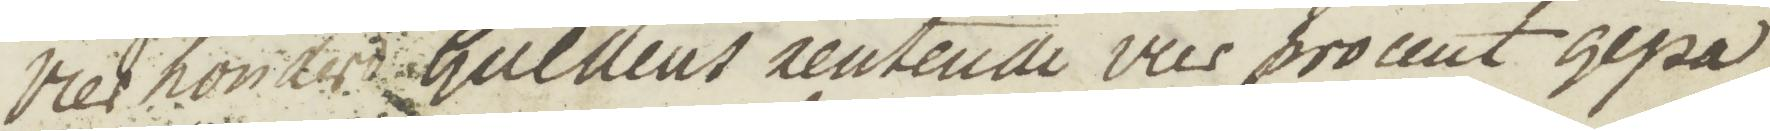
Vier honderd guldens rentende vier procent gepa
